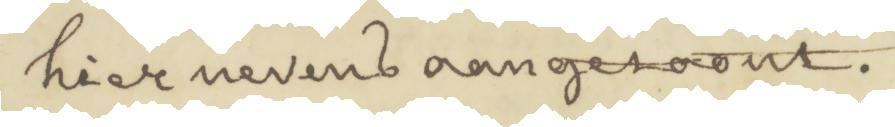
hier nevens aangetoont.
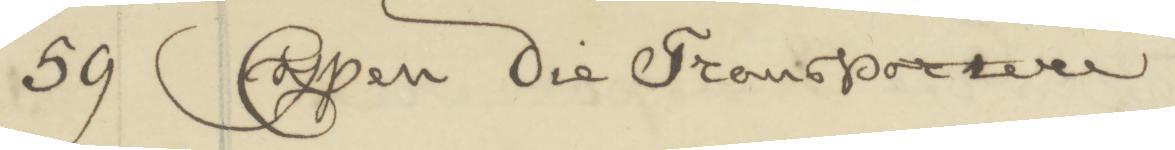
59 Coppen die Transportere
